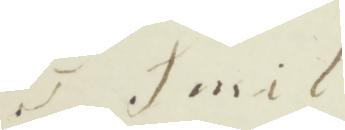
T. Smit
